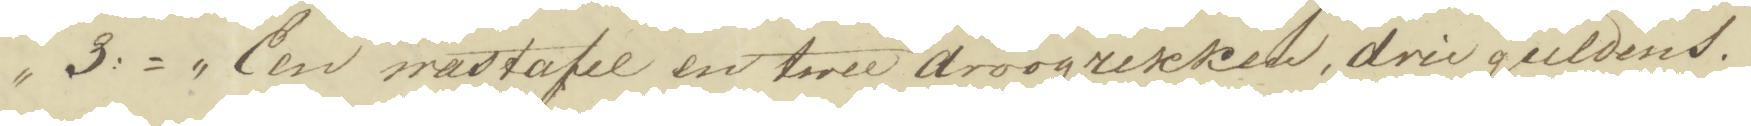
„ 3: = „ Een wastafel en twee droogrekken, drie guldens.
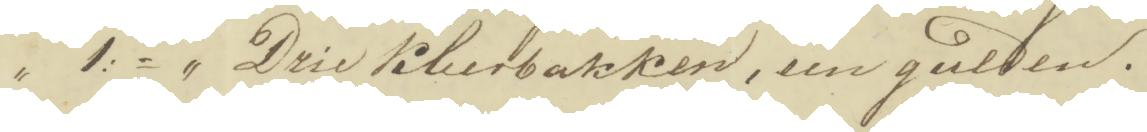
„ 1: = „ Drie kleerbakken, een gulden.
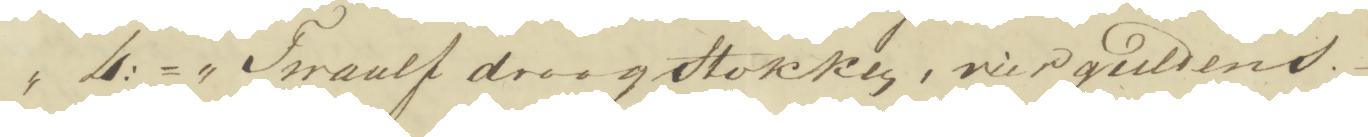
„ 4: = „ Twaalf droog stokken, vier guldens.
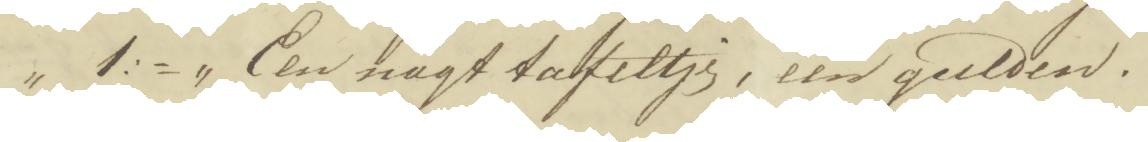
„ 1:=„ Een nagt tafeltjen, een gulden.
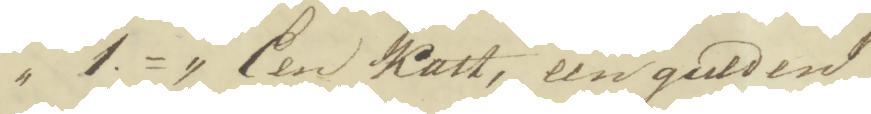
„ 1.= „ Een kast, een gulden
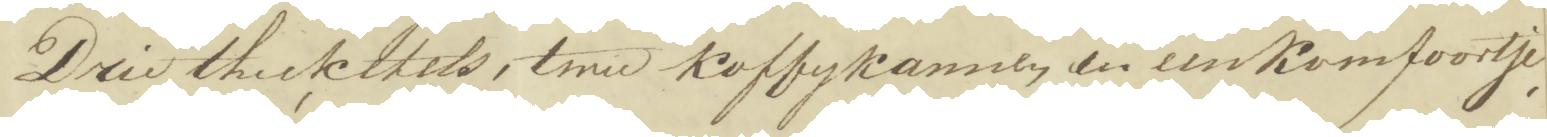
Drie theeketels, twee koffykannen en een komfoortje,
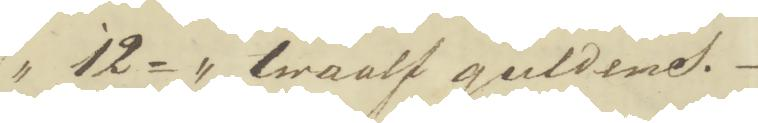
„ 12= „ twaalf guldens.-
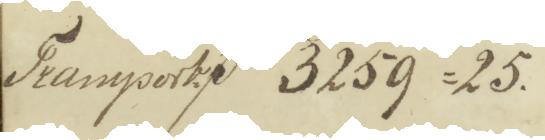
Transport ƒ 3259 =25.
